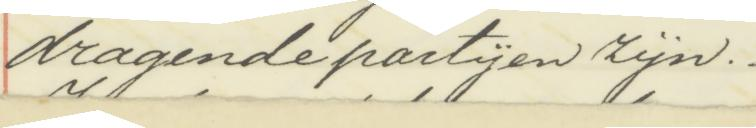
dragende partijen zijn.
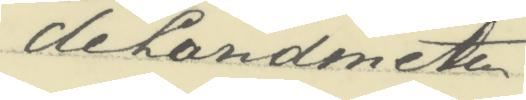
de Landmeter
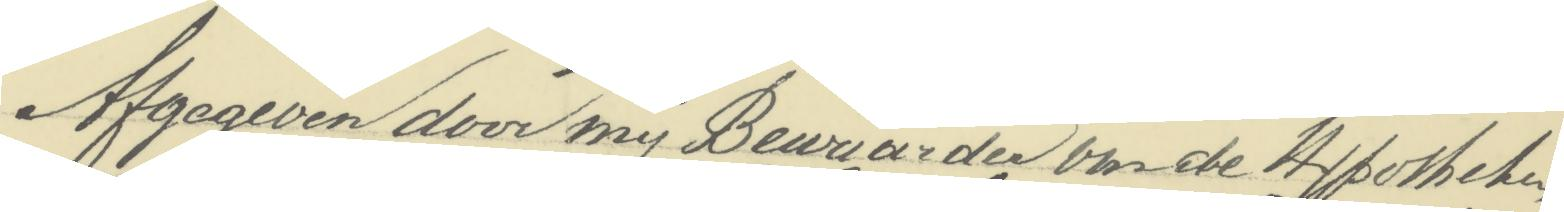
Afgegeven door my Bewaarder vam de Hypotheken
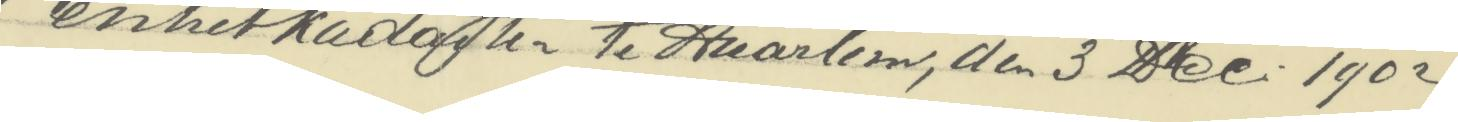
en het kadaster te Haarlem, den 3 Dec. 1902
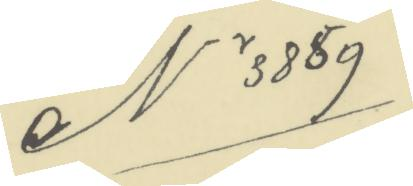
Nr 3889
